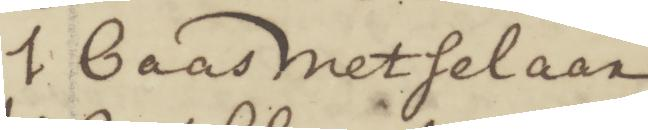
1 baas metselaar
